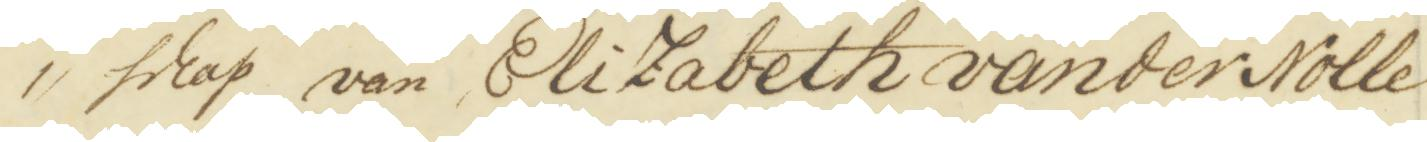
„schap van Elizabeth van der Nolle
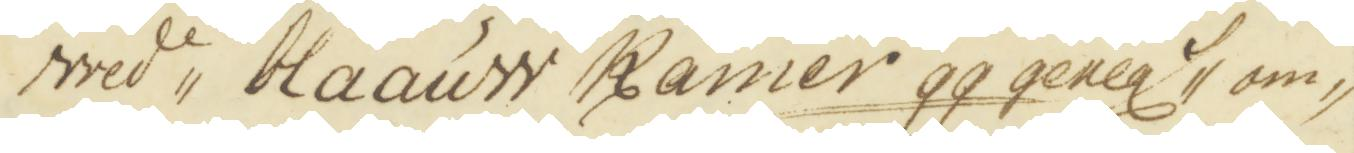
wed„e blaauw Kamer qq gereq„s om„
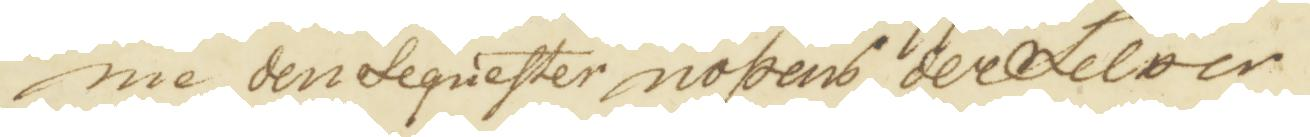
me den sequester nopens der selver
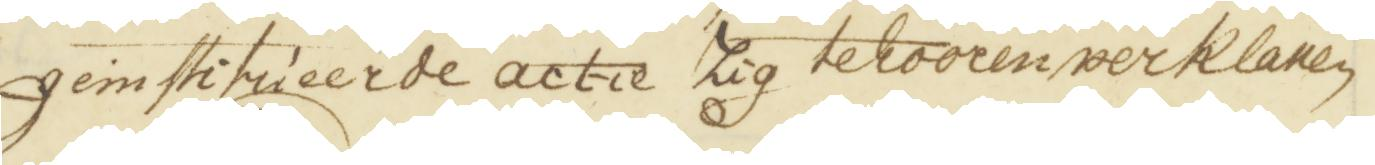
geinstitueerde actie zig te hooren verklaren
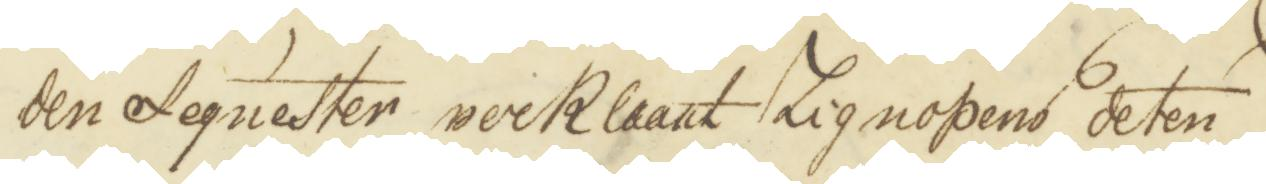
den Sequester verklaart zig nopens deten
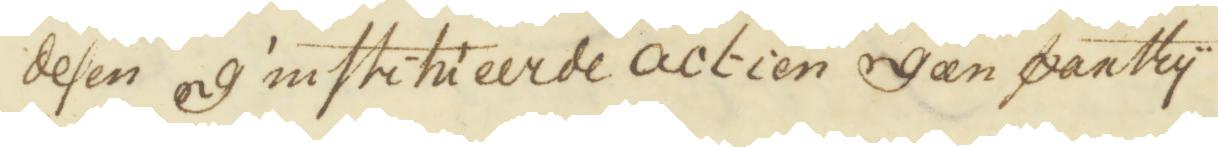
desen g'institueerde actien van parthij
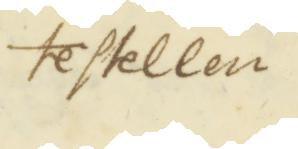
te stellen
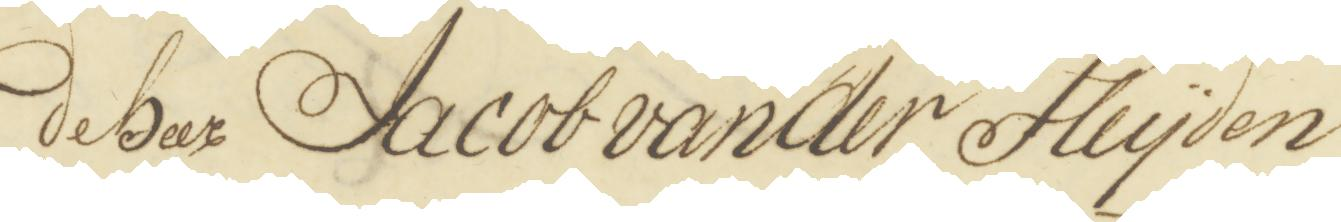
de heer Jacob van der Heijden
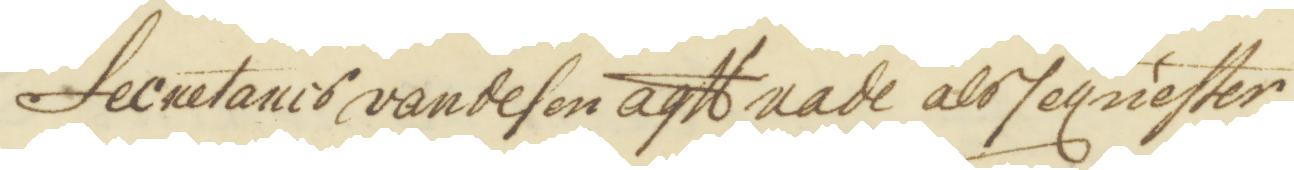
Secretaris van desen agtb rade als sequester
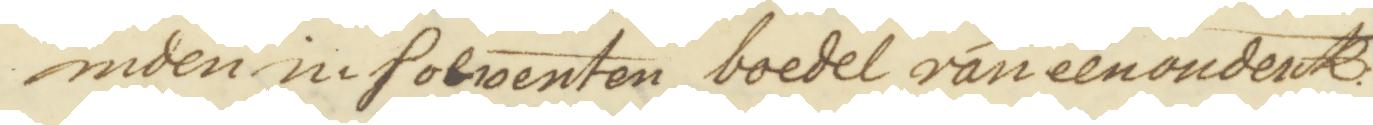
inden insolventen boedel van een onderz:
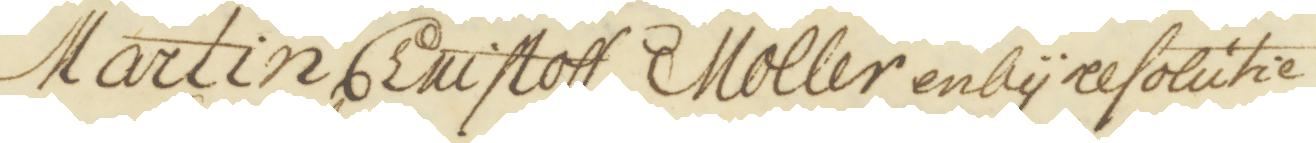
Martin Christoff Moller en bij resolutie
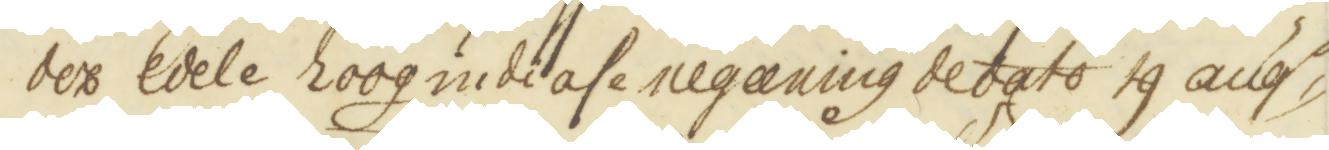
der Edele hoog indiase regeering de dato 19 aug„s
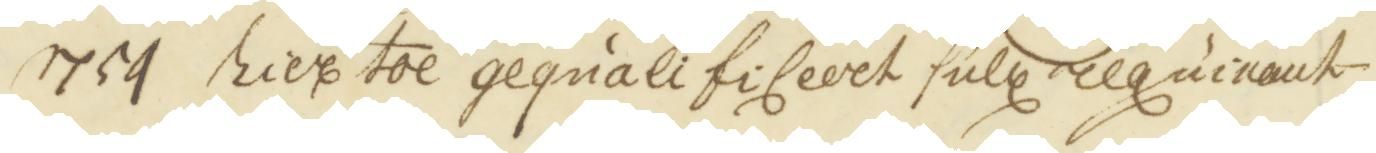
1754 hier toe gequalificeert sulx requirant
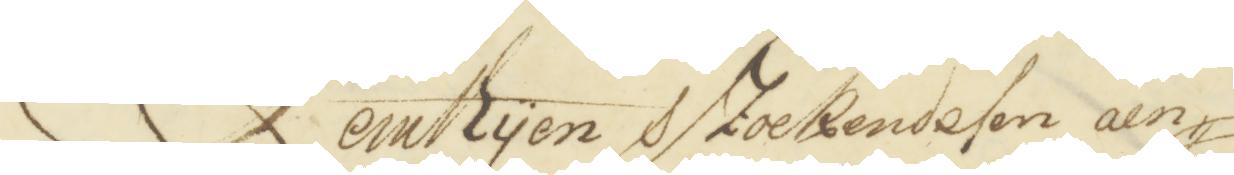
Parthijen verzoekendesen aen„
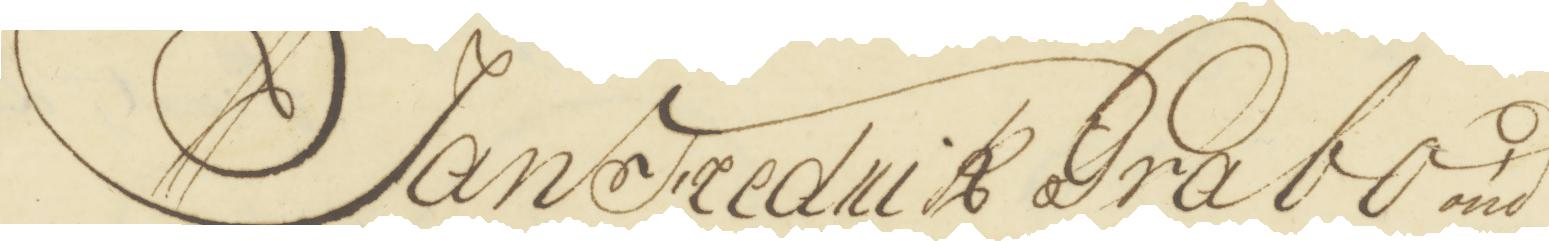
Jan Fredrik Grabo oud
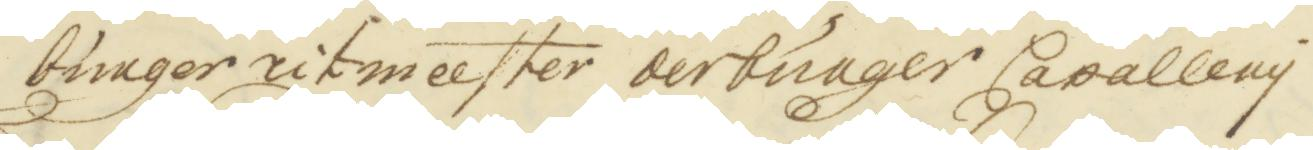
burger ritmeester der burger Cavallerij
